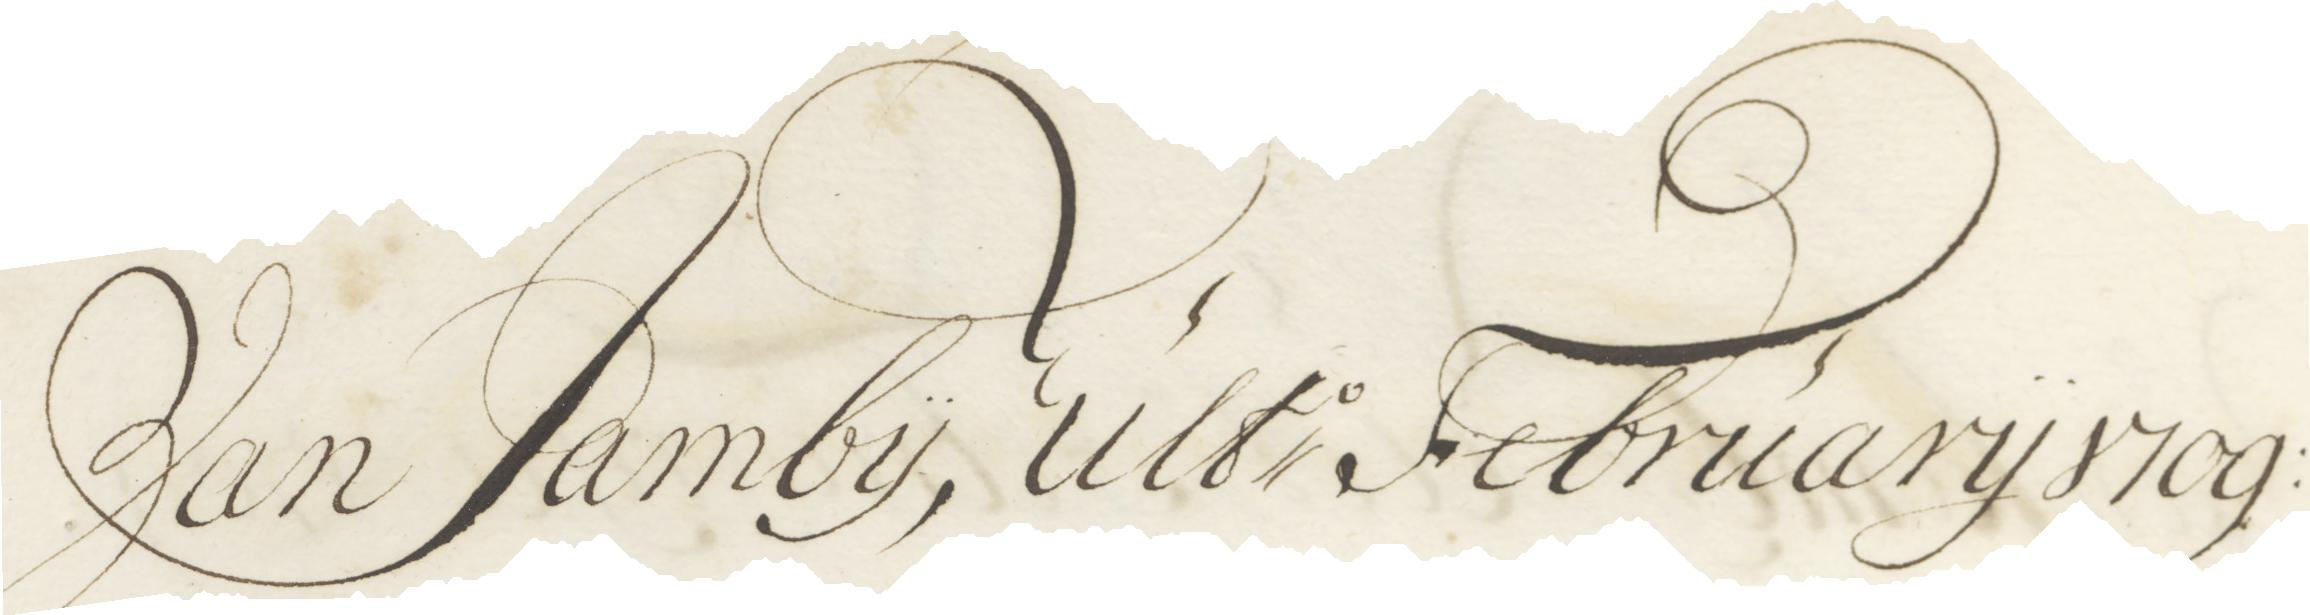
Van Jambij, ult„o Februarij 1709:
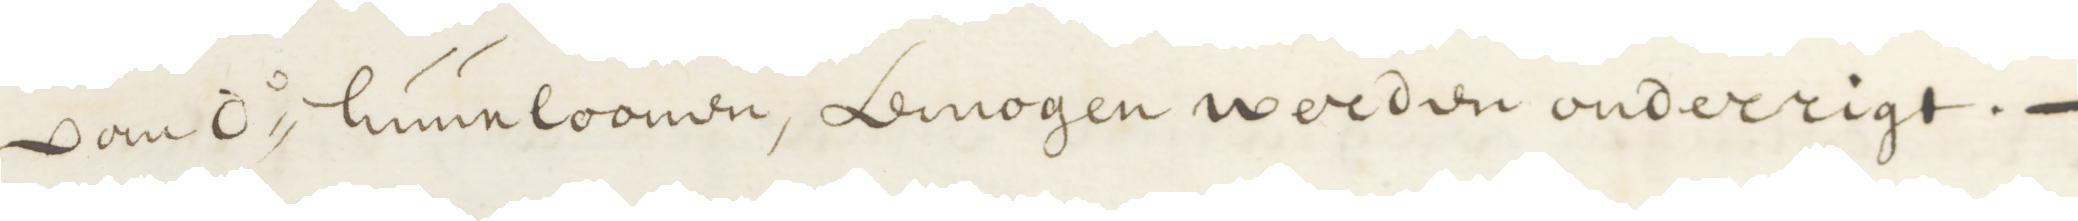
van d„o huurloonen, te mogen werden onderrigt.—
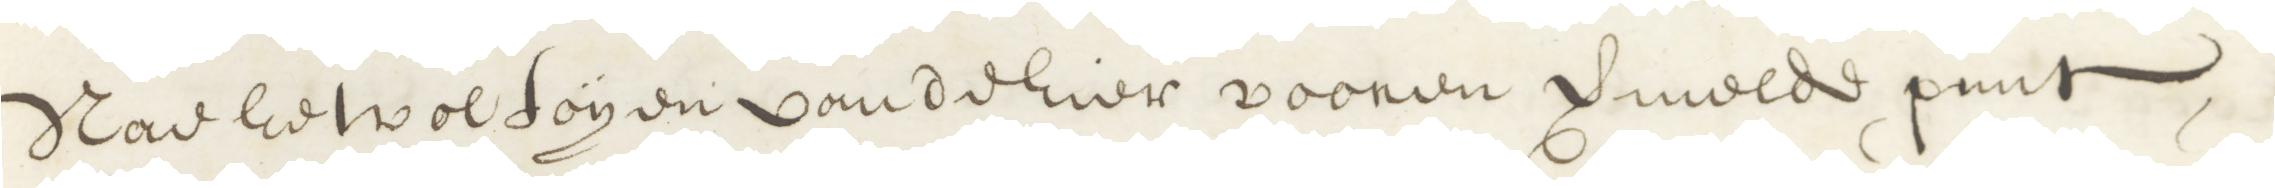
Nae het voltoijen van de hier vooren vermelde punt,
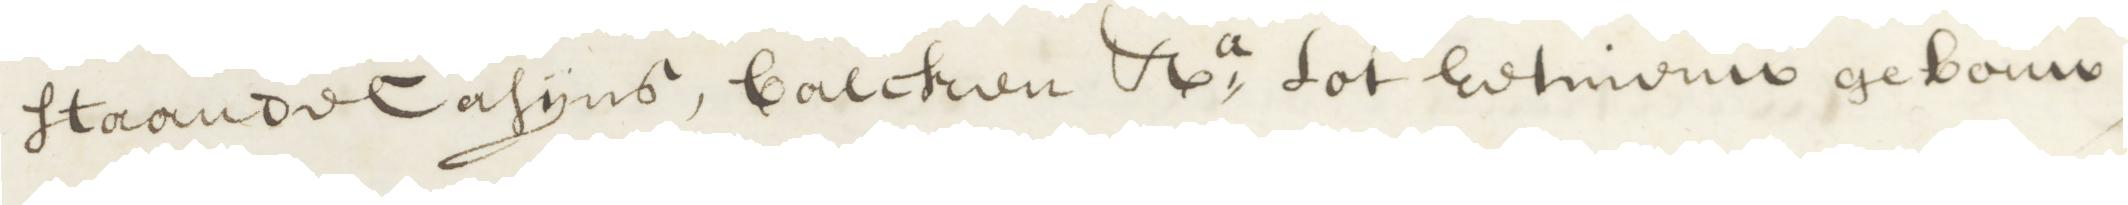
staan de casijns, balcken Etc„a tot het nieuw gebouw
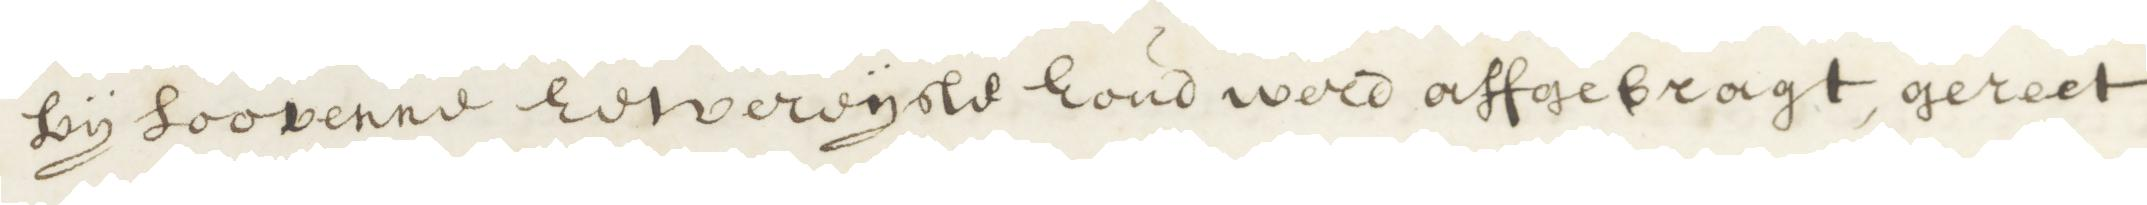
bij sooverre het vereijste houd werd affgebragt, gereet
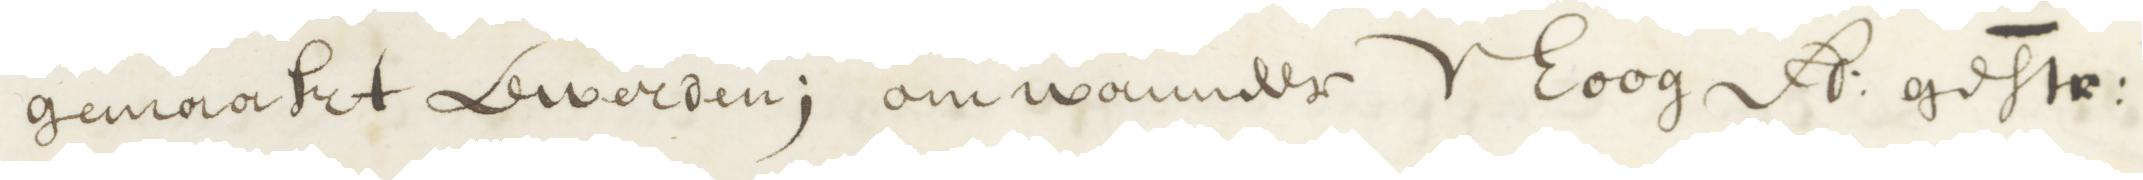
gemaakt te werden; om wanneer V hoog Ed: gestr:
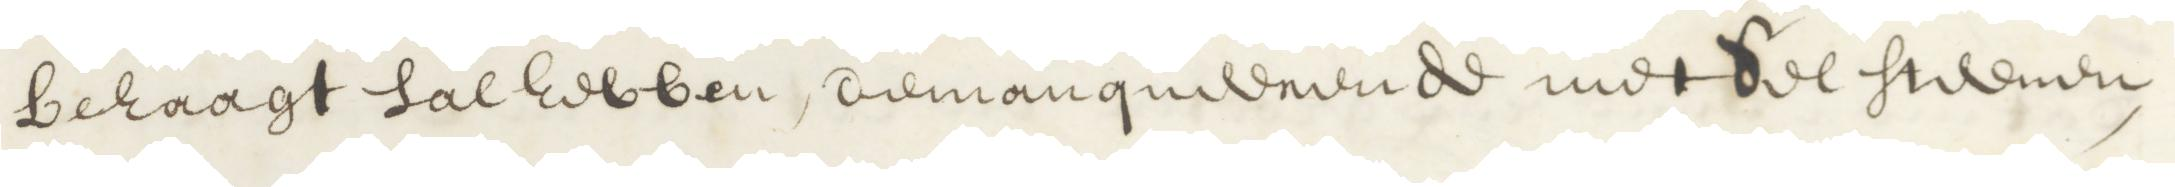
behaagt sal hebben, demanqueerende metsel steenen,
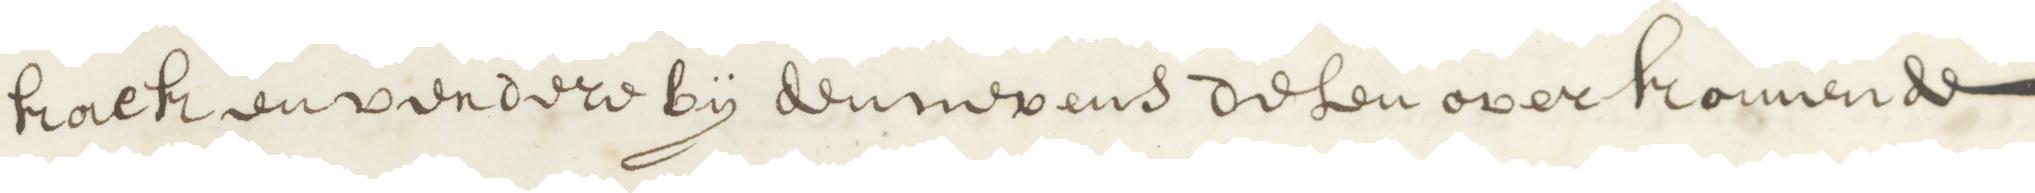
kalk en verdere bij den nevens desen overkomende
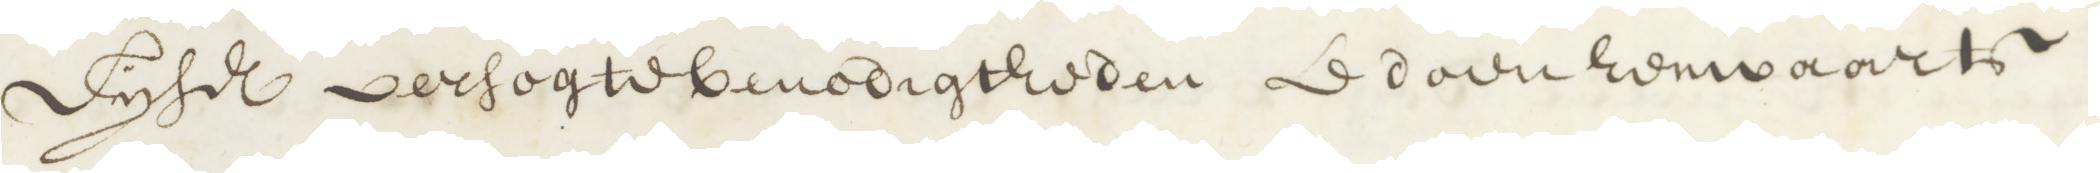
Eijsch versogte benodigtheden te doen herwaarts
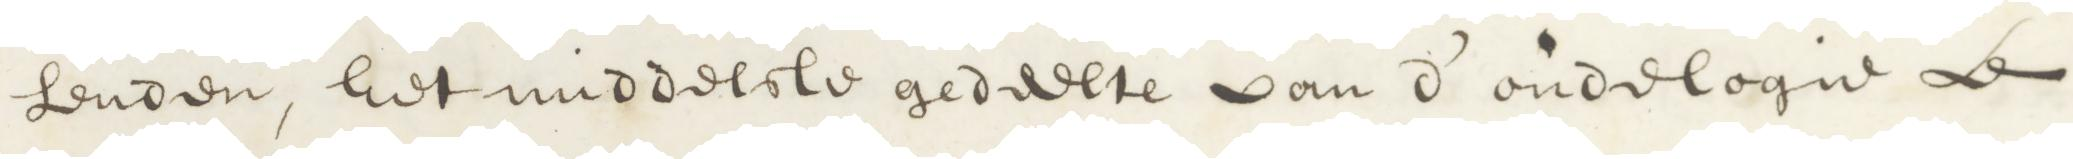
senden, het middelste gedeelte van d’ oudelogie te
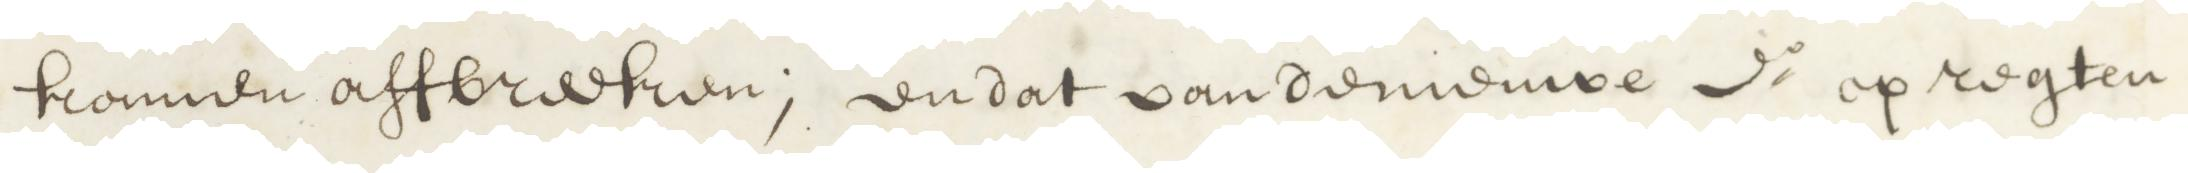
konnen affbreeken; en dat van de nieuwe _„o op regten
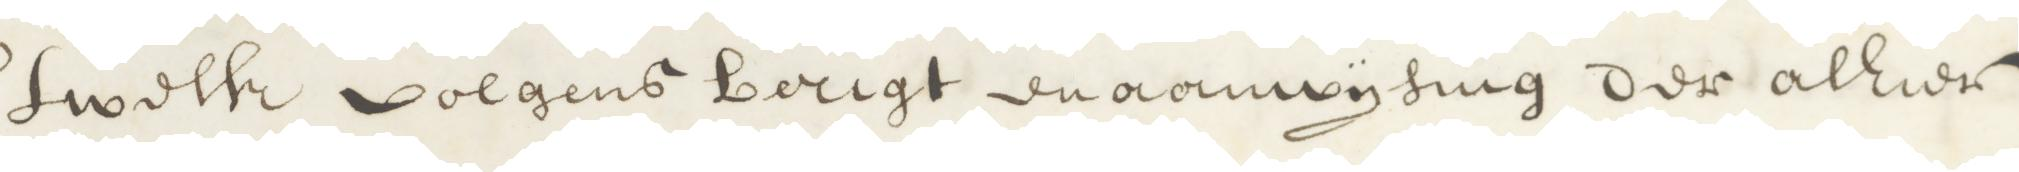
't welk volgens berigt en aanwijsing der alhier
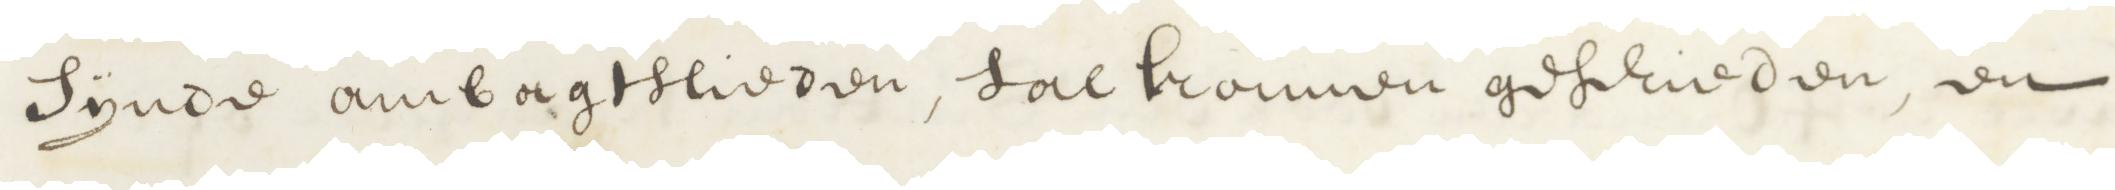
sijnde ambagtslieden, sal konnen geschieden, en
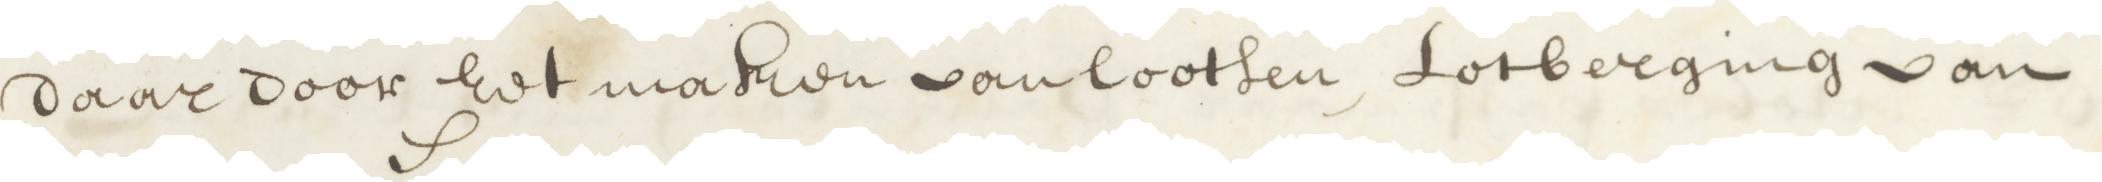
daar door het maken van lootsen, tot berging van
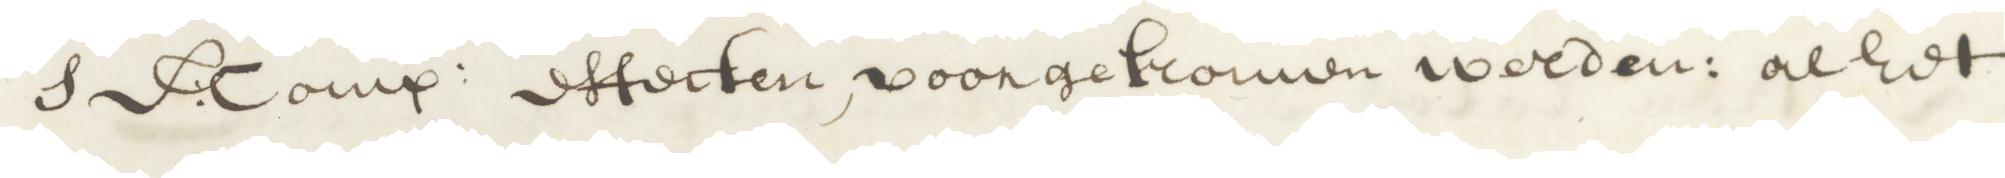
's E: Comp:s effecten, voorgekomen werden: al het
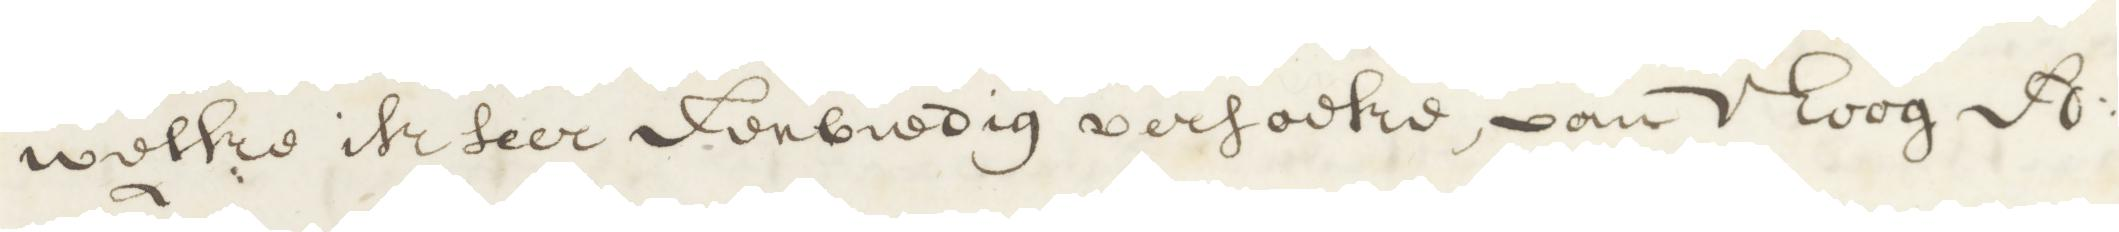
welke ik seer Eerbiedig versoeke, van V hoog Ed:
